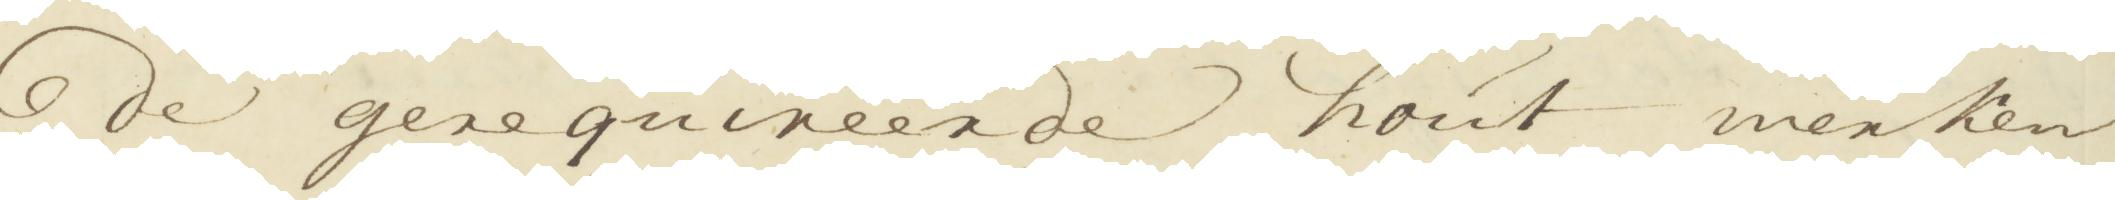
de gerequireerde hout werken
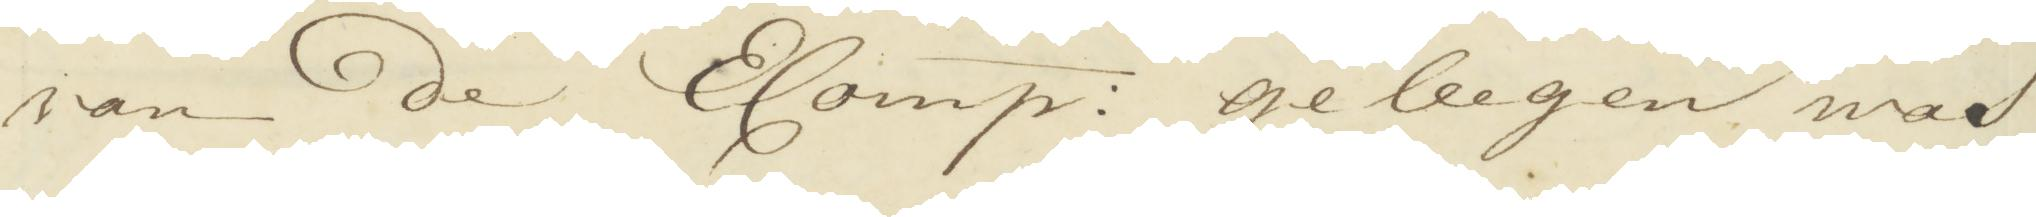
van de EComp: geleegen was,
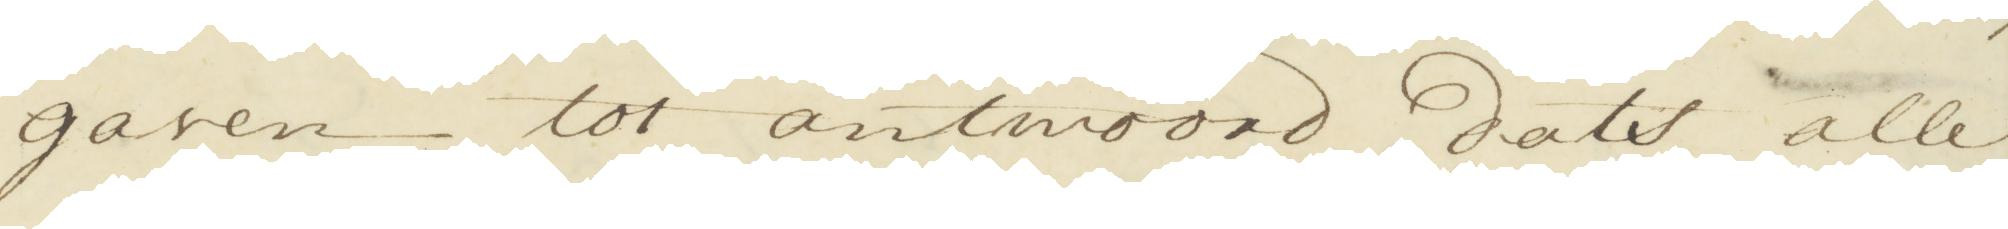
gaven tot antwoord dats alle
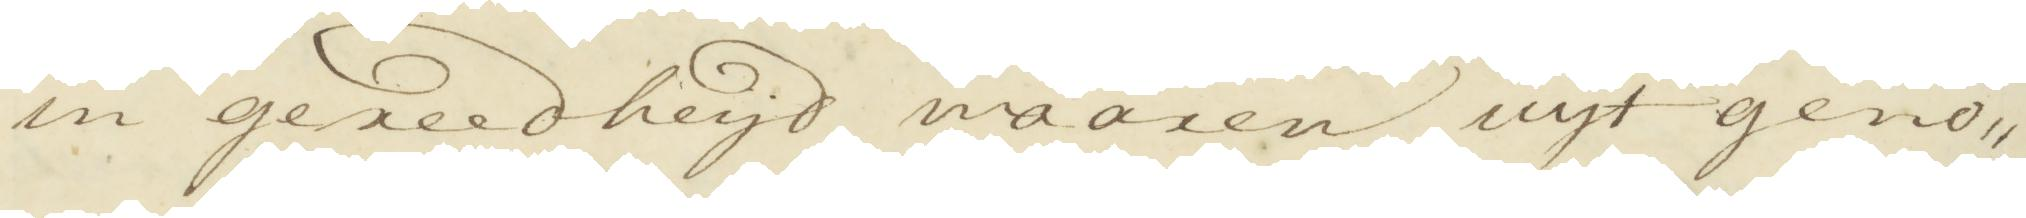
in gereedheijd waaren uijt geno„
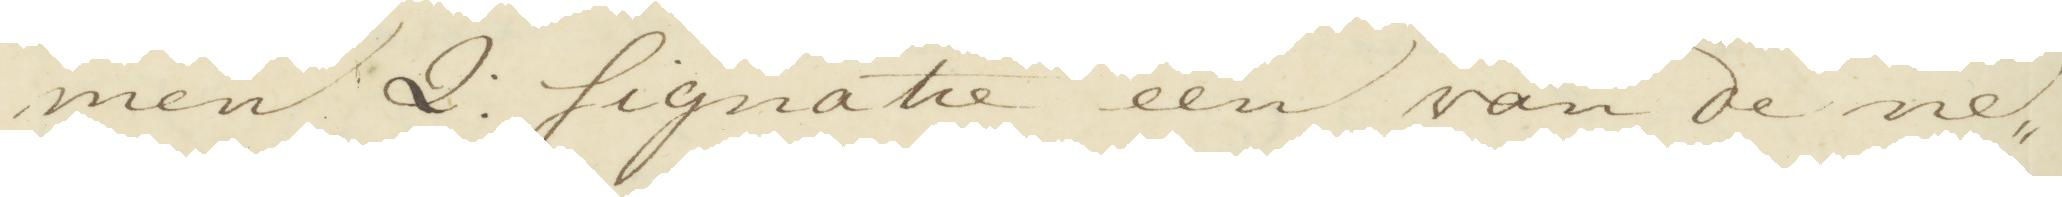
men 2: signatie een van de ne„
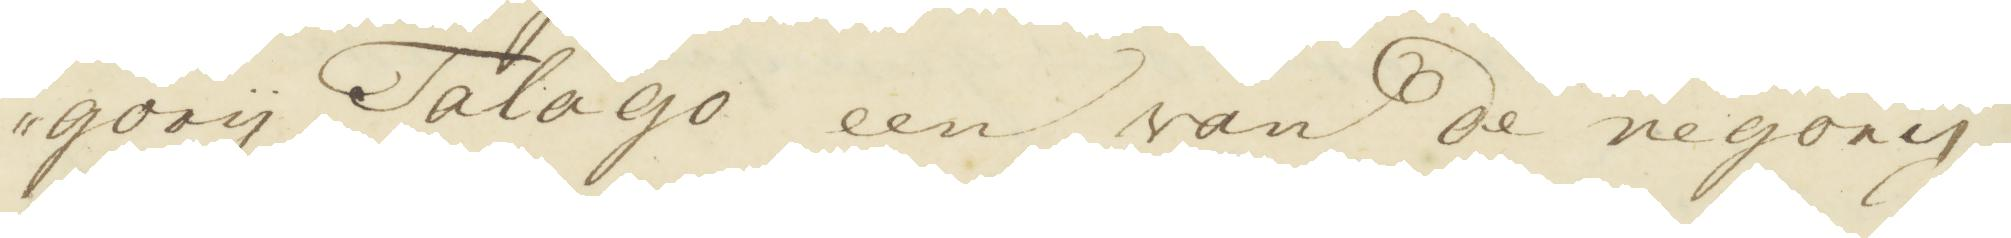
„gorij Talago een van de negorij
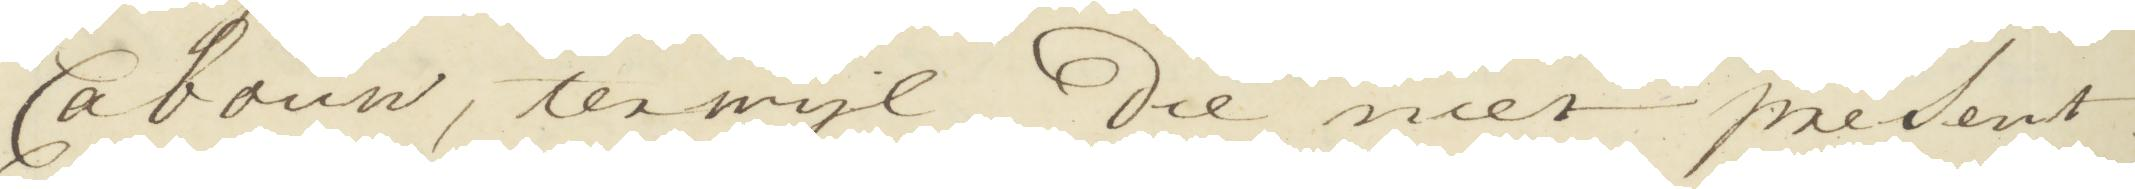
Cabouw, terwijl die niet present
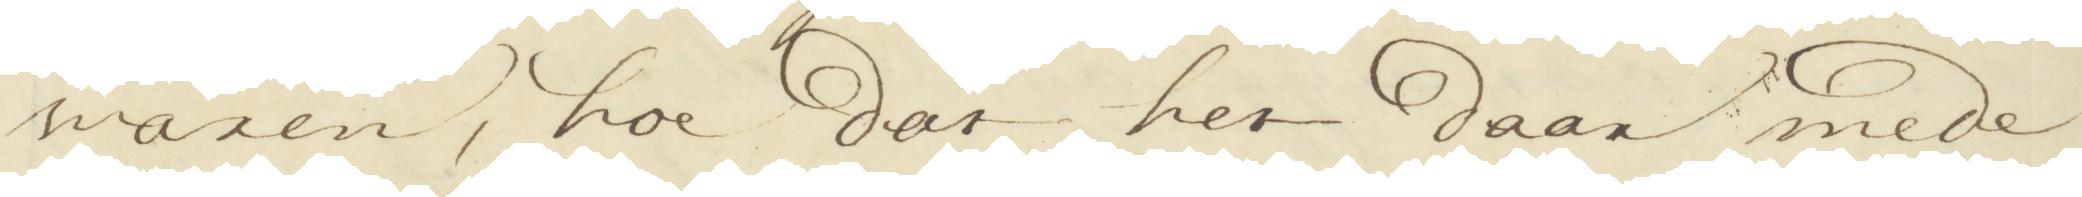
waren, hoe dat het daar mede
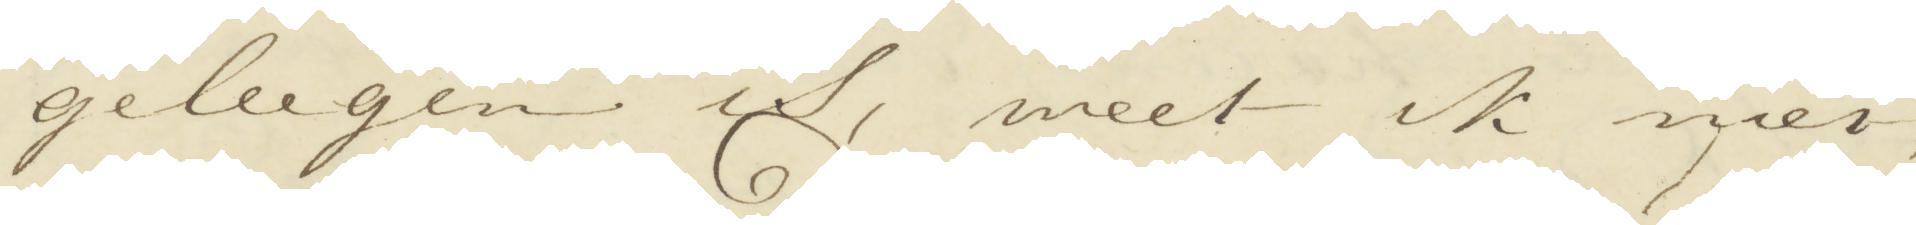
geleegen is, weet ik niet
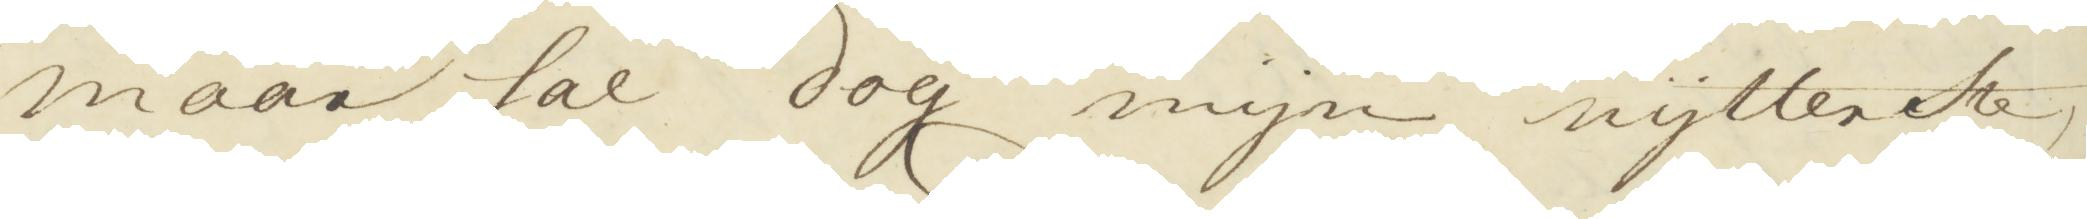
maar sal dog mijn uijtterste
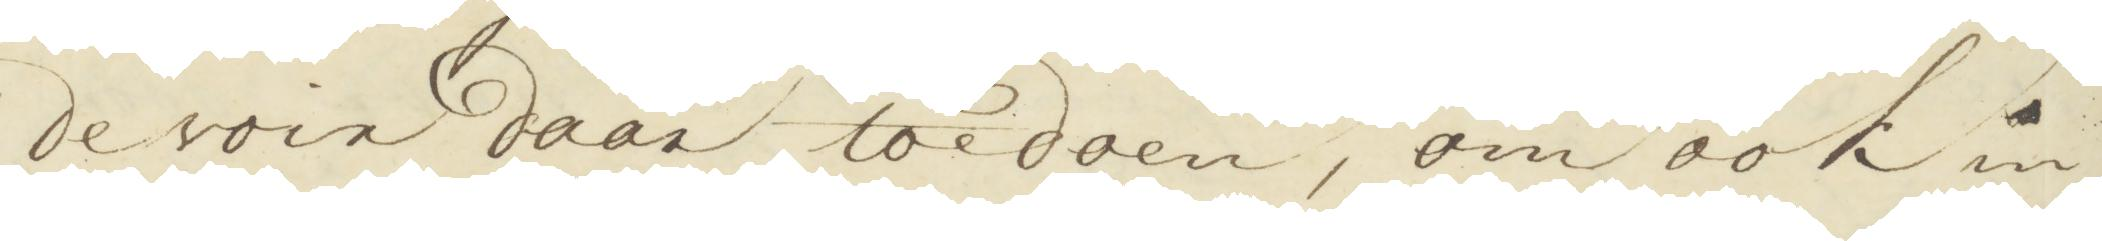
devoir daar toe doen, om ook in
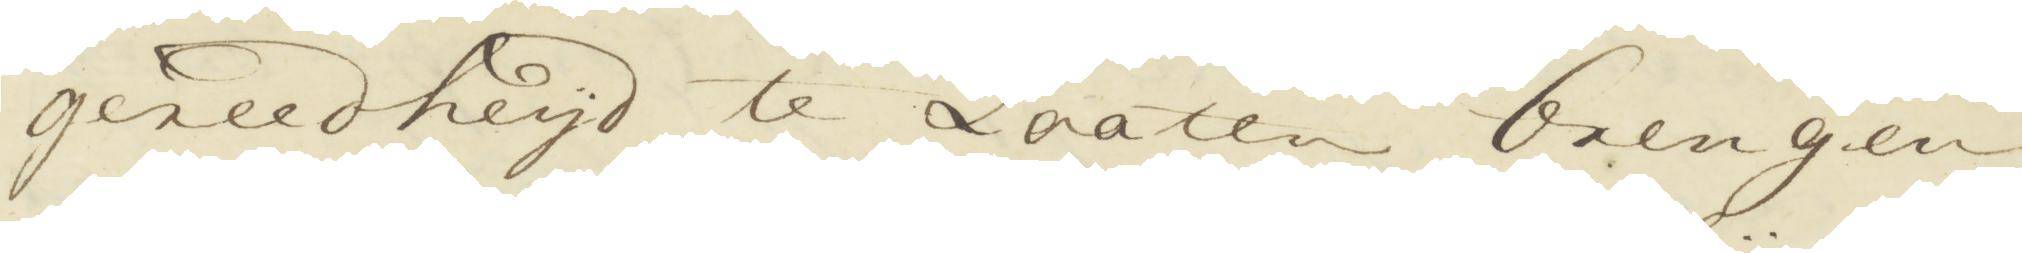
gereedheijd te Laaten brengen,
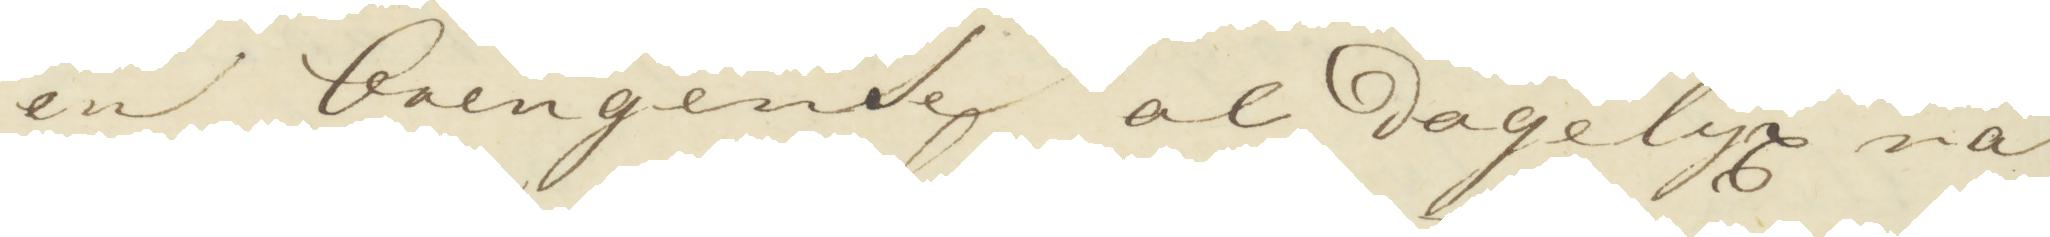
en brengense al dagelijx na
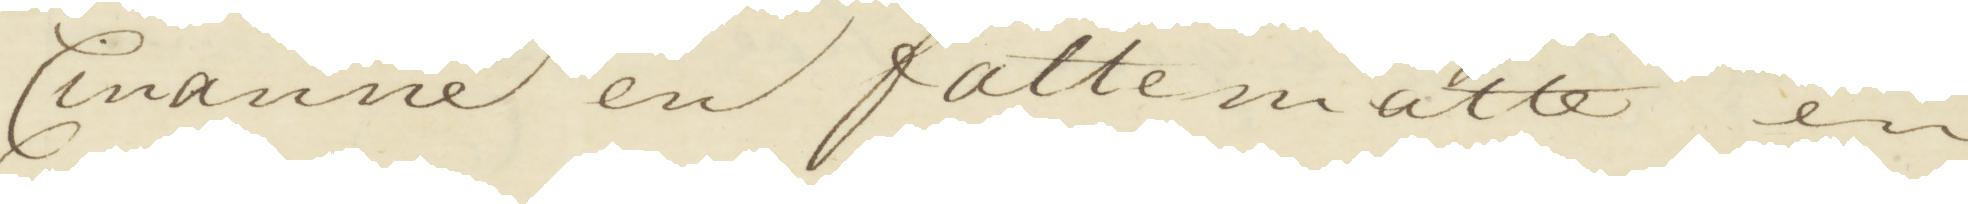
Cinanne en fatte matte en
